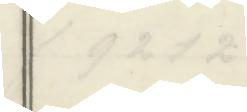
ƒ 9212
